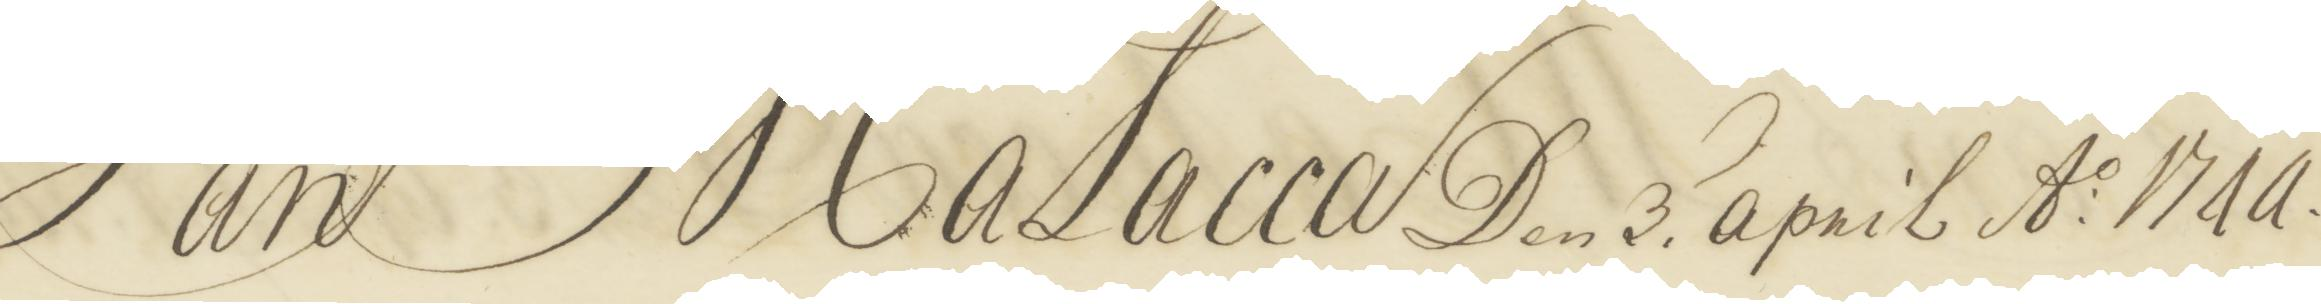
Van Malacca Den 3.' april A:o 1744.
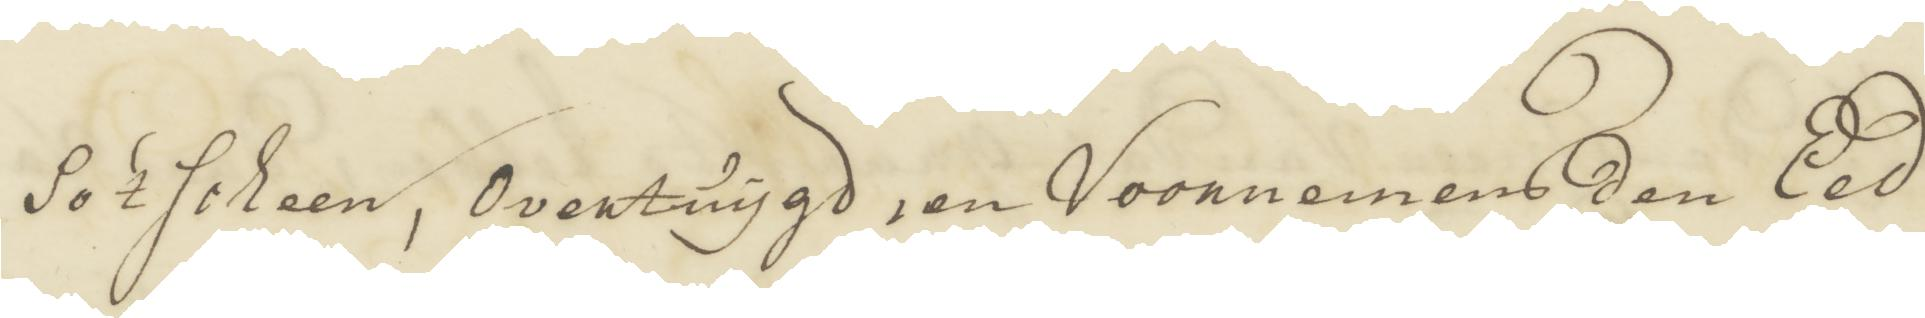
so 't scheen, overtuijgd, en voornemens den Eed
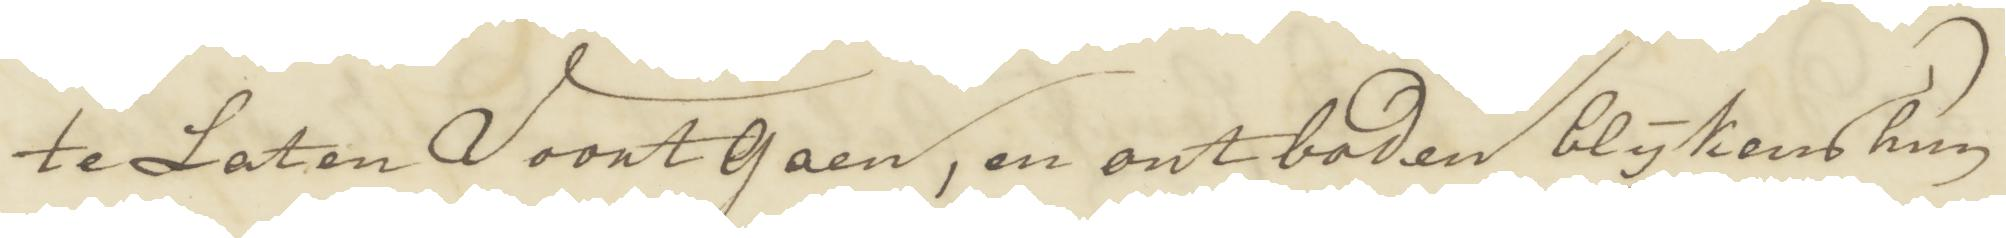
te Laten voortgaen, en ontboden blijkens hun
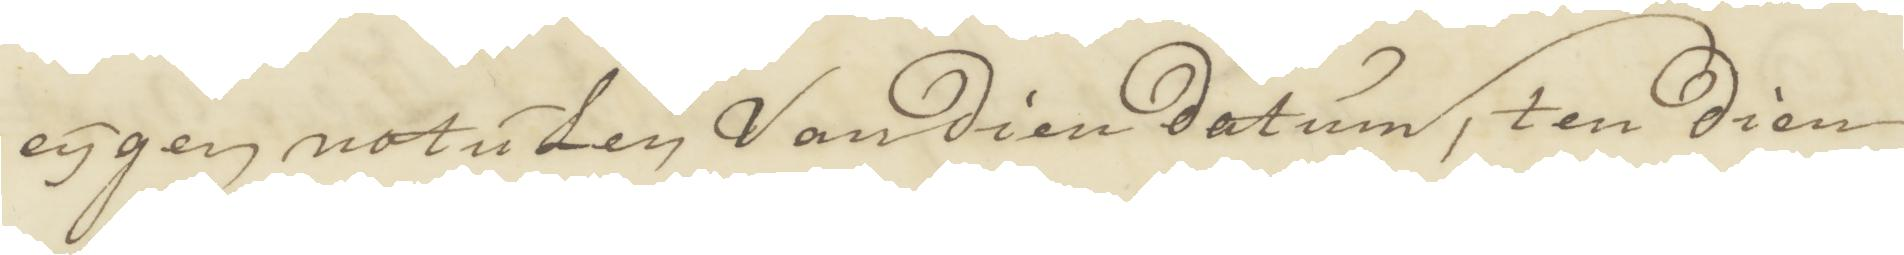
eijgen notulen van dien datum, ten dien
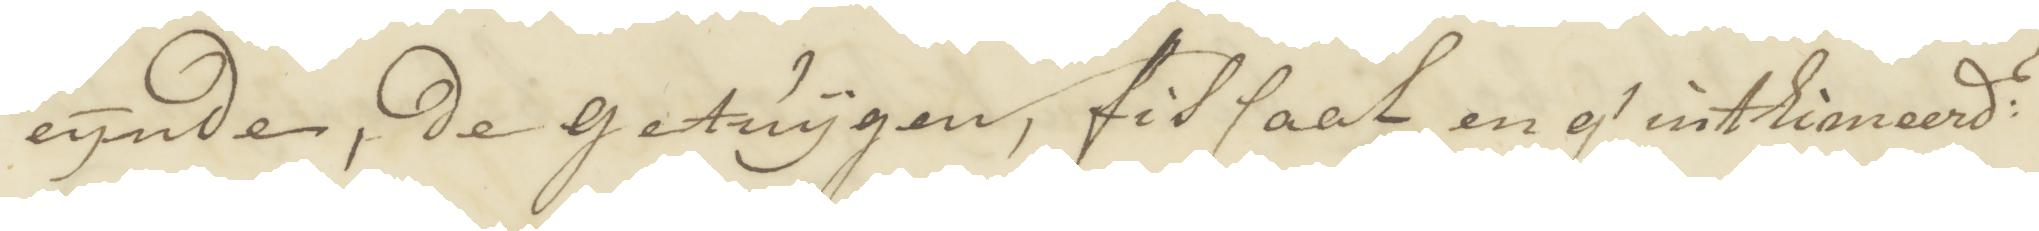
eijnde, de getuijgen, fiscaal en g’inthimeerd:s
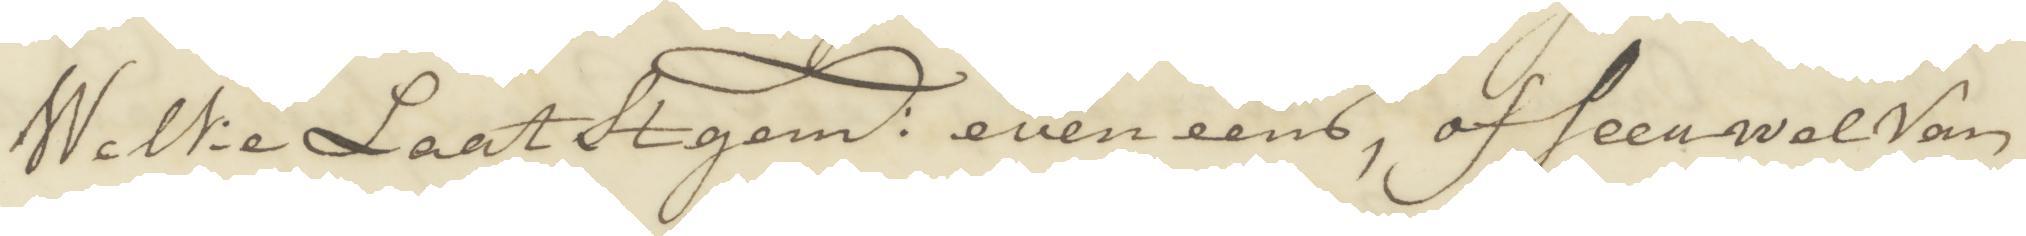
Welke Laatstgem: even eens, of seer wel van
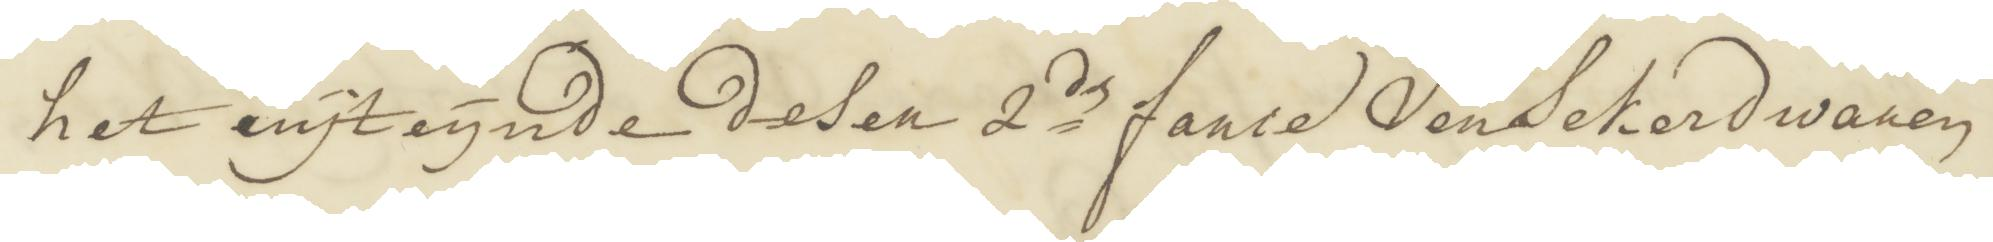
het uijt eijnde deser 2=den farce versekerd waren
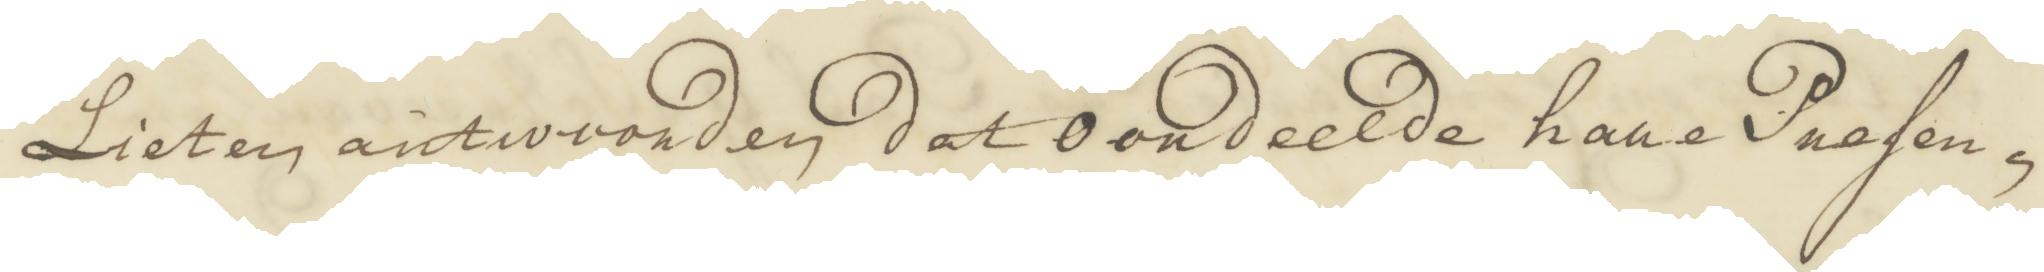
Lieten antwoorden dat oordeelde hare Presen„
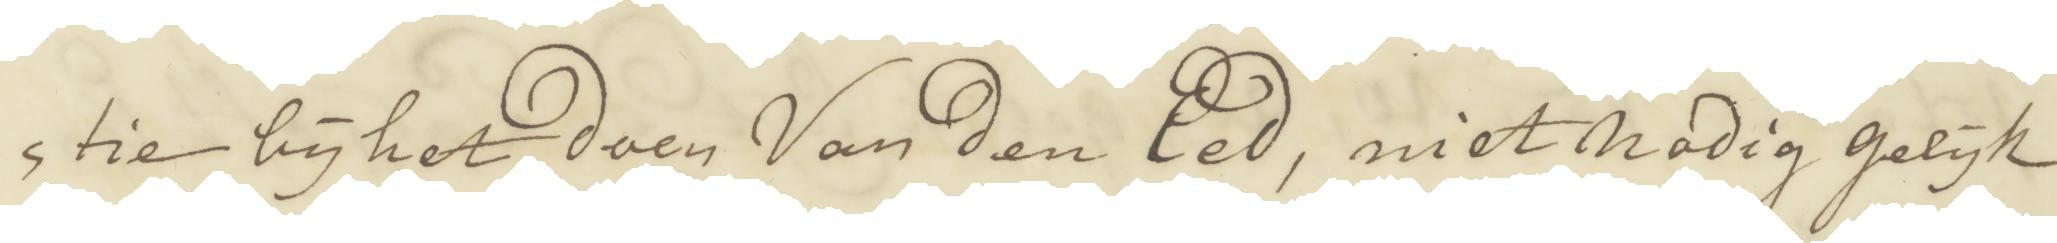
„tie bij het doen van den Eed, niet nodig gelijk
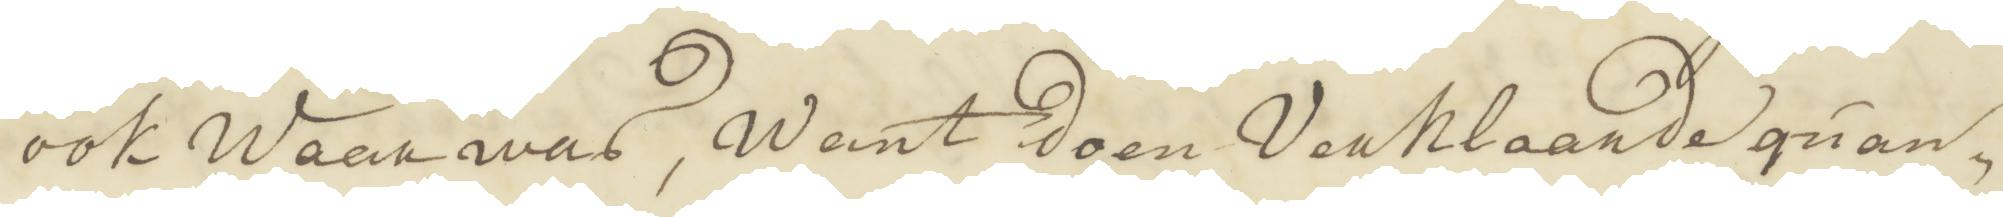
ook waar was, want doen verklaarde quan„
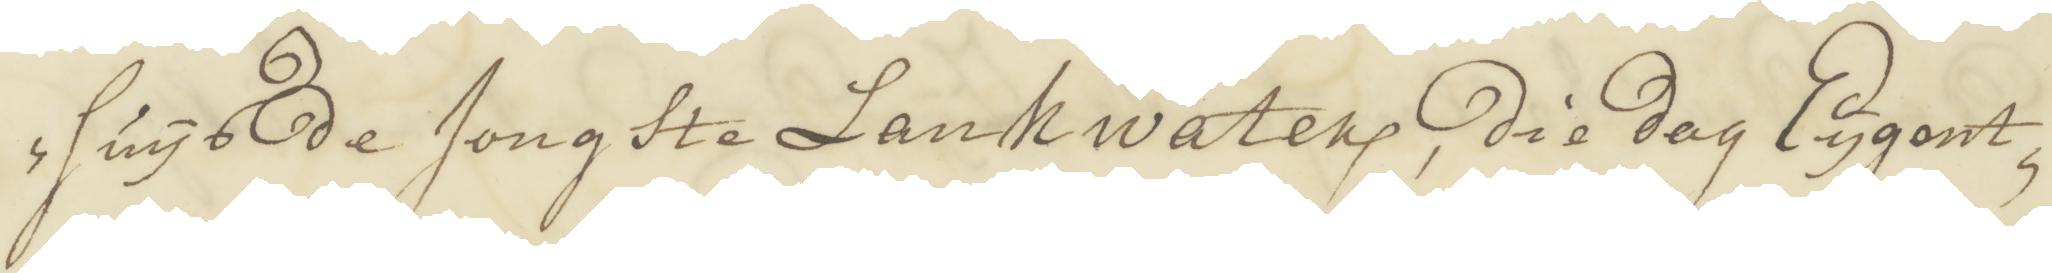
„suijs de jongste Lankwater, die dag Eijgent„
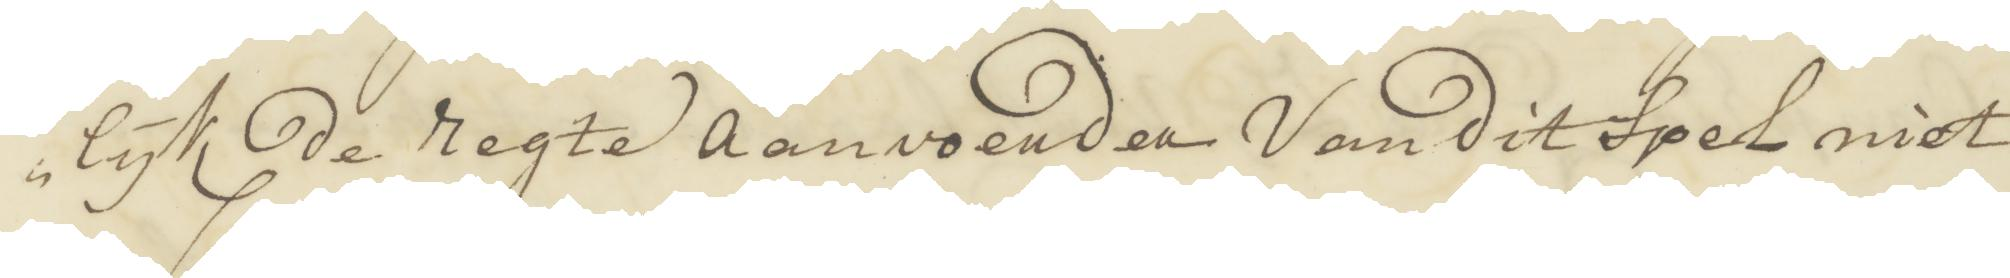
„lijk de regte aanvoerder van dit spel niet
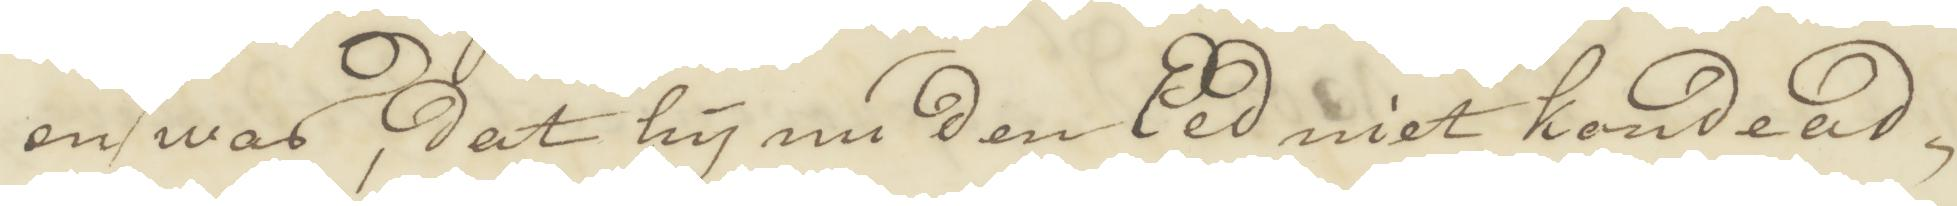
en was, dat hij nu den Eed niet konde ad„
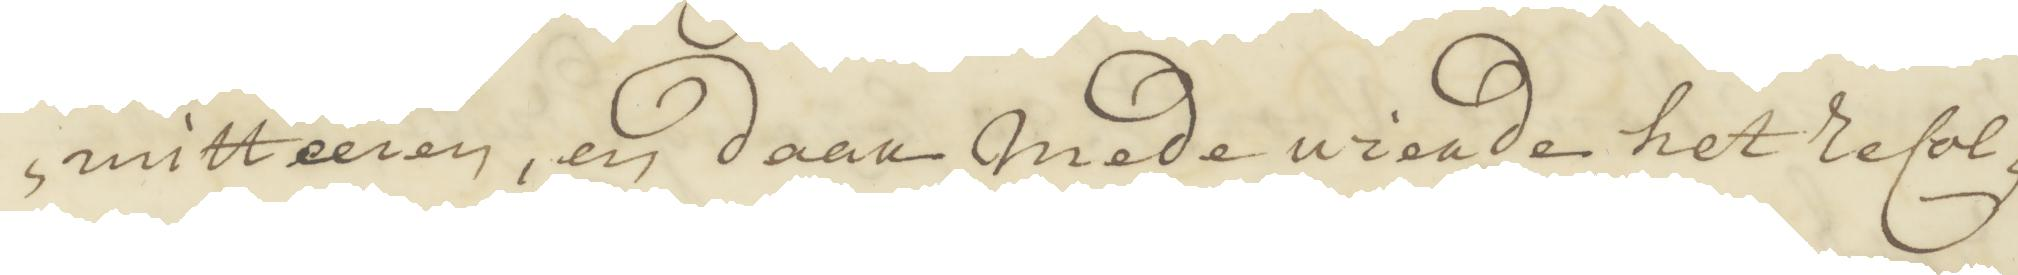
„mitteeren, en daar mede wierde het recol
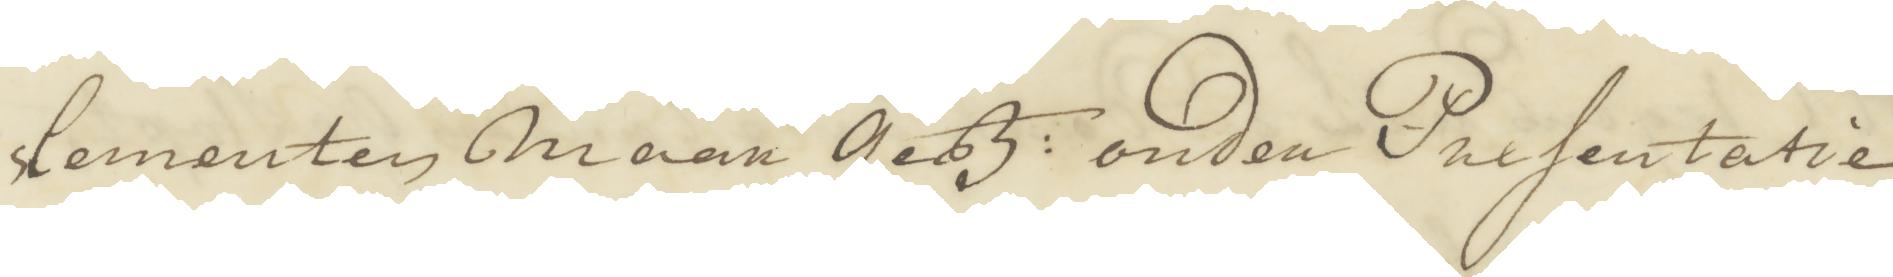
lementen maar gesz: onder Presentatie
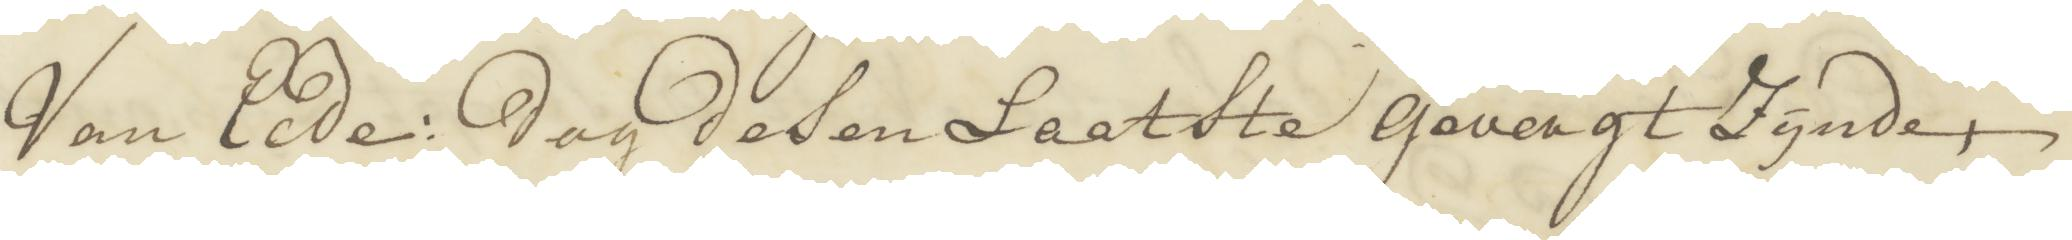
van Eede: dag desen Laatste gevergt zijnde,
